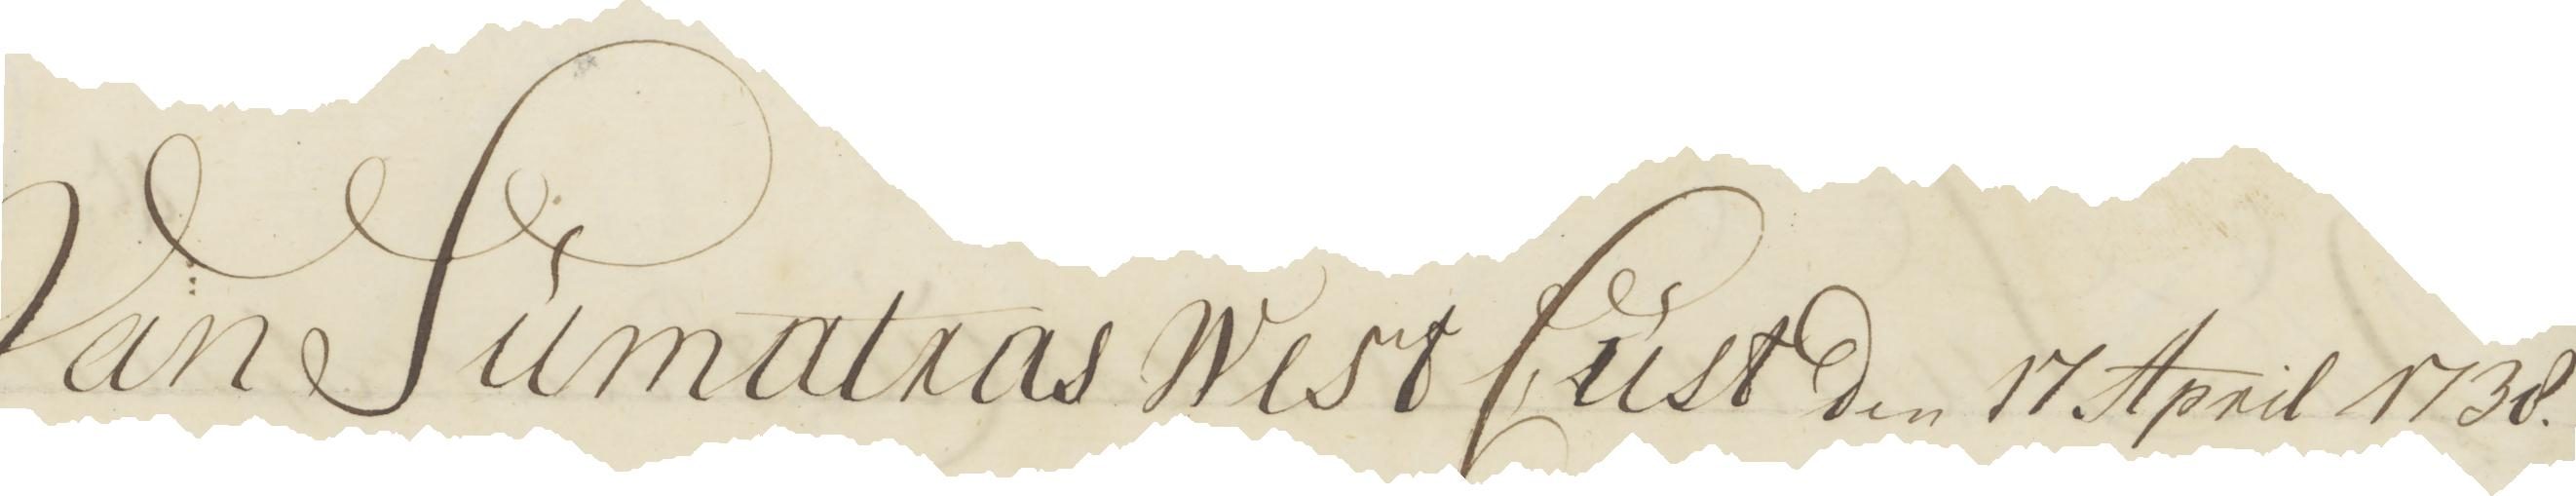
Van Sumatras West Cust den 17 April 1738.
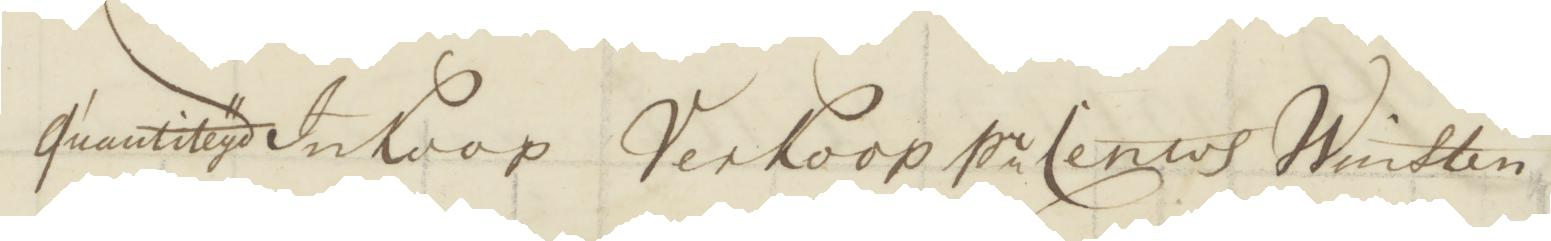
quantiteijd Inkoop Verkoop p„r Centos Winsten
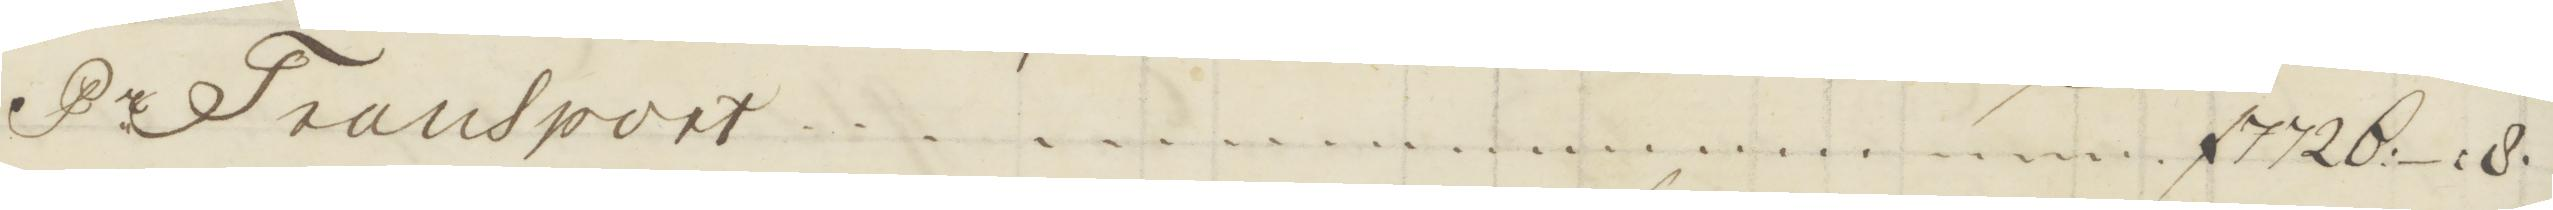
P„r Transport . . . . . . . . . . . . . . . . . . . . . . . . . . . . ƒ7726:—:8.
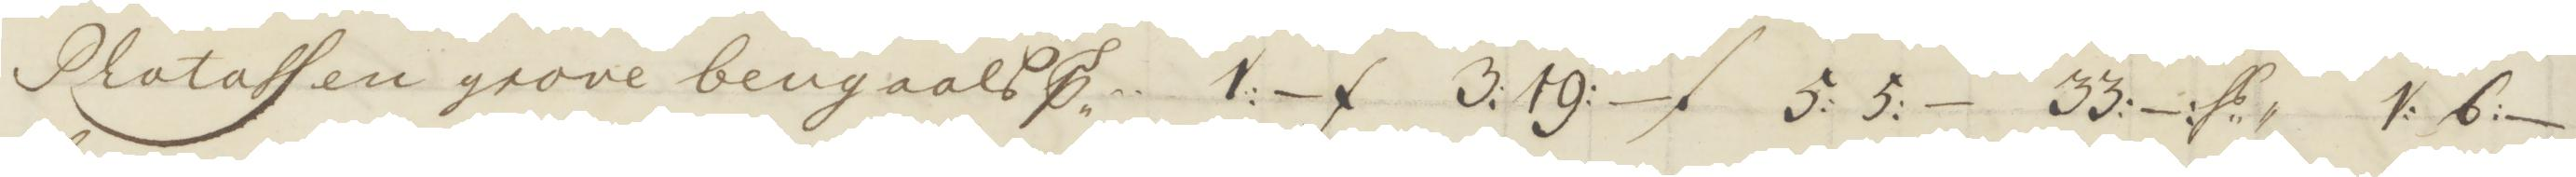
Photassen grove bengaals p„s 1:—ƒ 3:19:—f 5: 5: — 33: — p„s„ 1:6:—
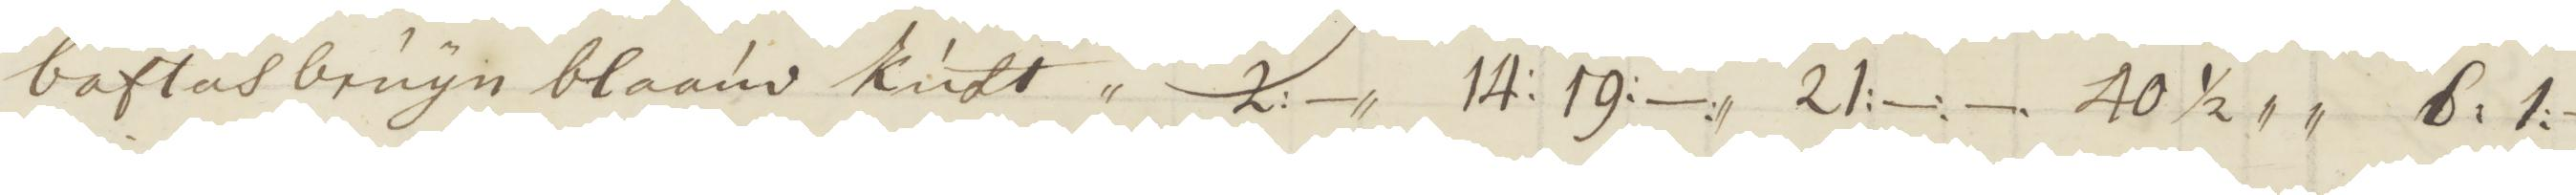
baftas bruijn blaauv kust „ 2:—„ 14:19:—:„ 21:—:—. 40½ „ „ 6:1:—
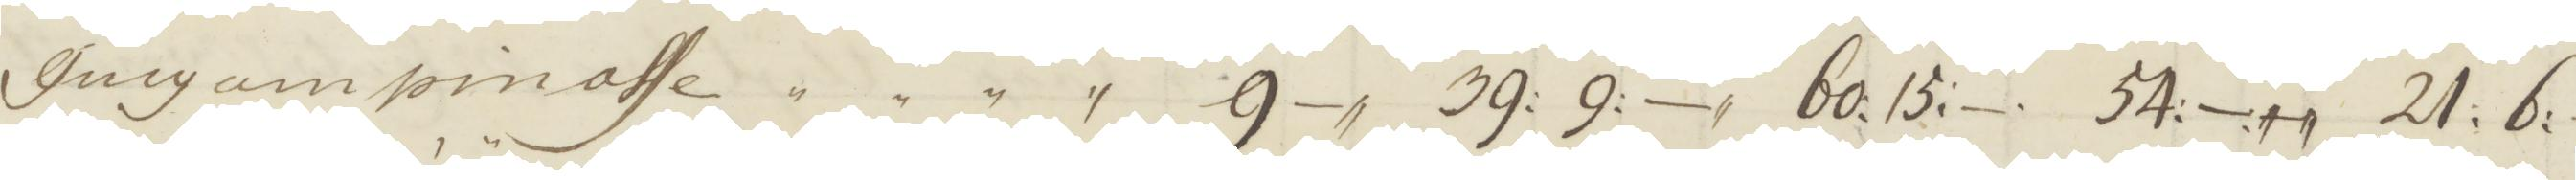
Gingam pinasse „ „ „ „ 9—„ 39: 9.—„ 60:15:—. 54:—:„_„ 21:6:—
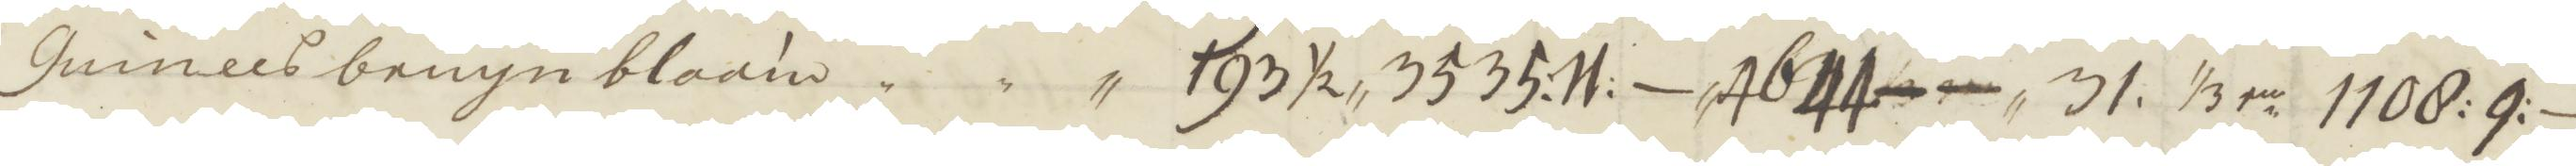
Guinees bruijn blaauv „ „ „ 193½„ 3535:11:—„4644— —„ 31.1/3 p„m 1108:9:—
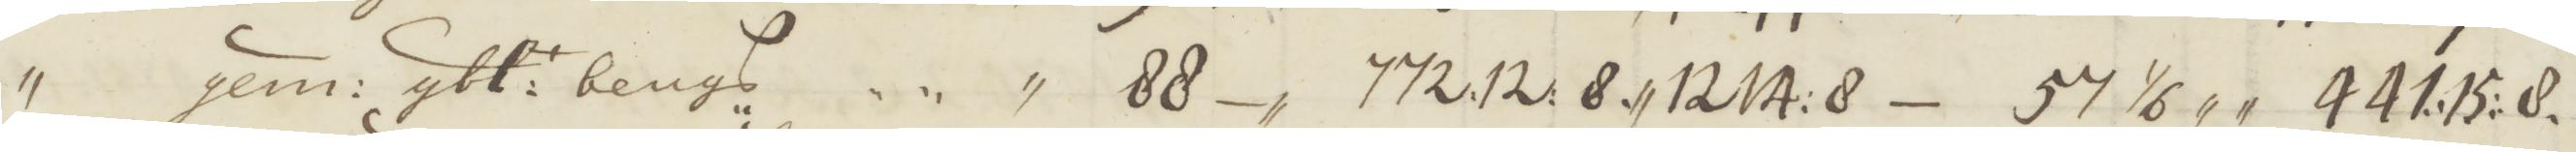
„ gem: gbl:t bengs „ „ „ 88—„ 772:12:8„1214:8 — 57 1/6„ „ 441:15: 8.
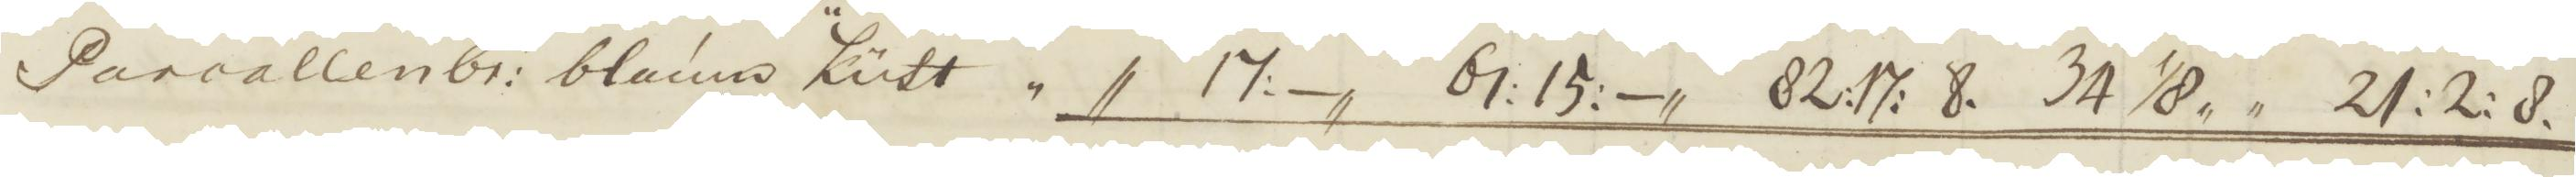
Parcallen br: blauw Kust „ „ 17:—„ 61:15.—„ 82:17:8. 34 1/8„ „ 21:2.8.
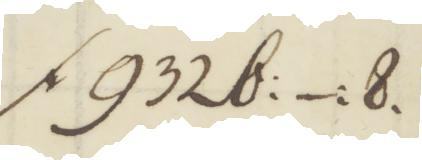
ƒ9326:—:8.
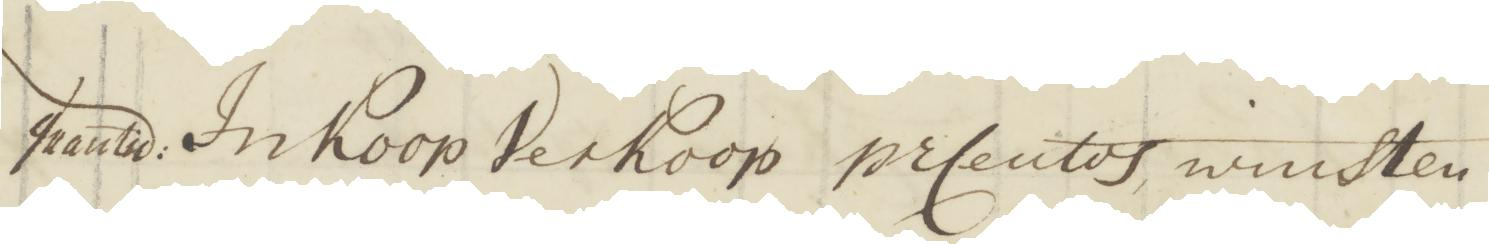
quantid: In Koop VerKoop prCenten, winsten
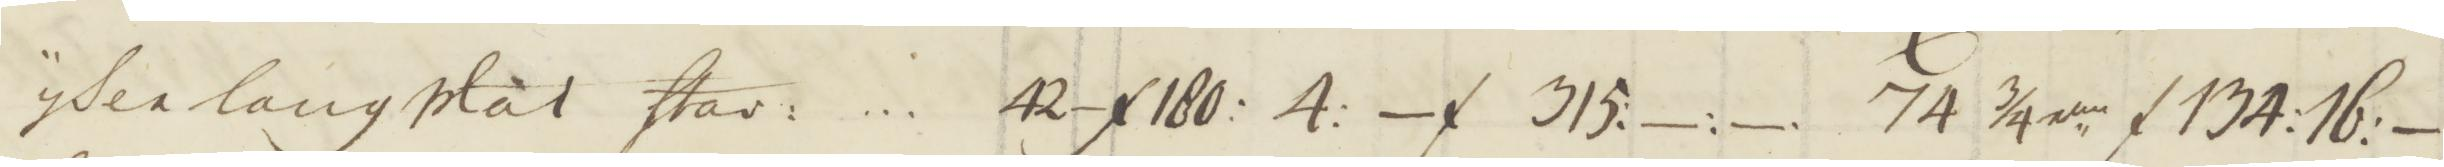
ijser lang plat stav: ... 42—ƒ180: 4:—ƒ 315:—:—. 74 ¾ r„m ƒ134:16:—
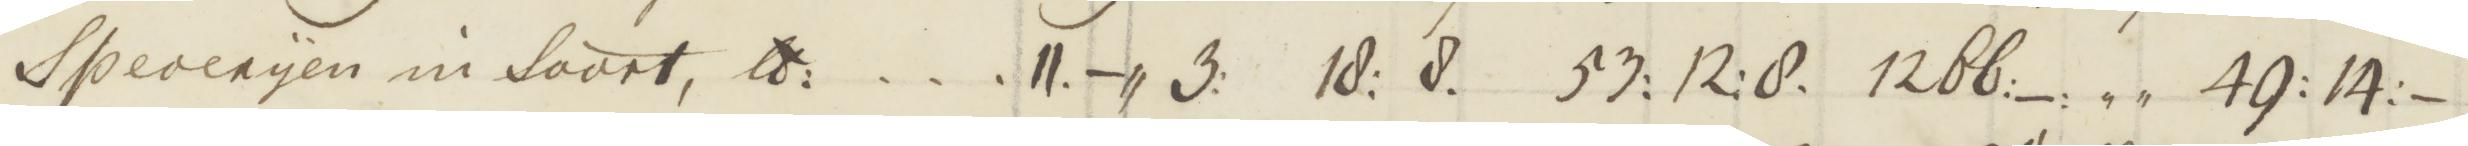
specerijen in soort, lb: ... 11.—„3: 18: 8. 53:12:8. 1266:—: „ „ 49:14:—
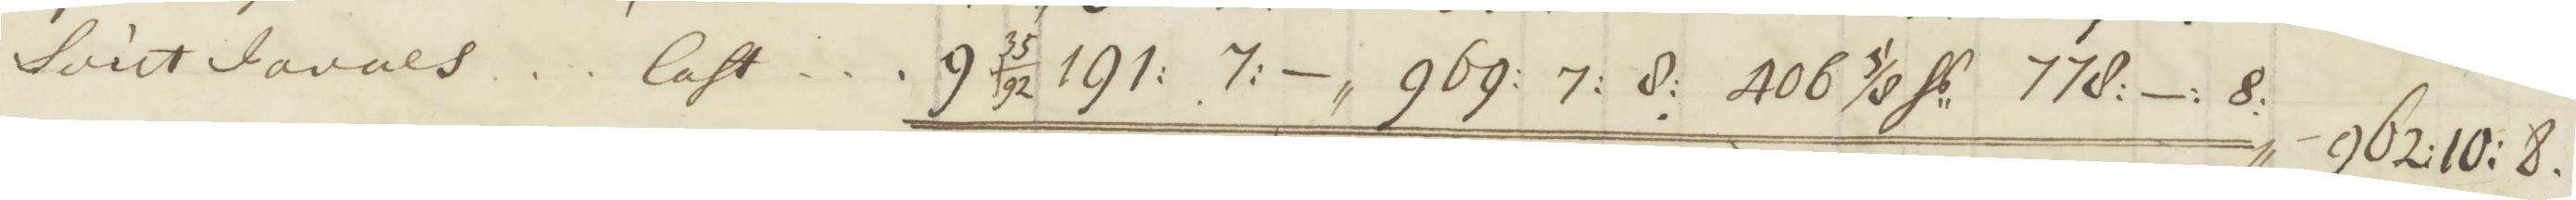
sout Javaes ... last ... 9 35/92 191:7:—„ 969:7:8: 406 5/8 s„s 778:—:8:„ -962:10.8.
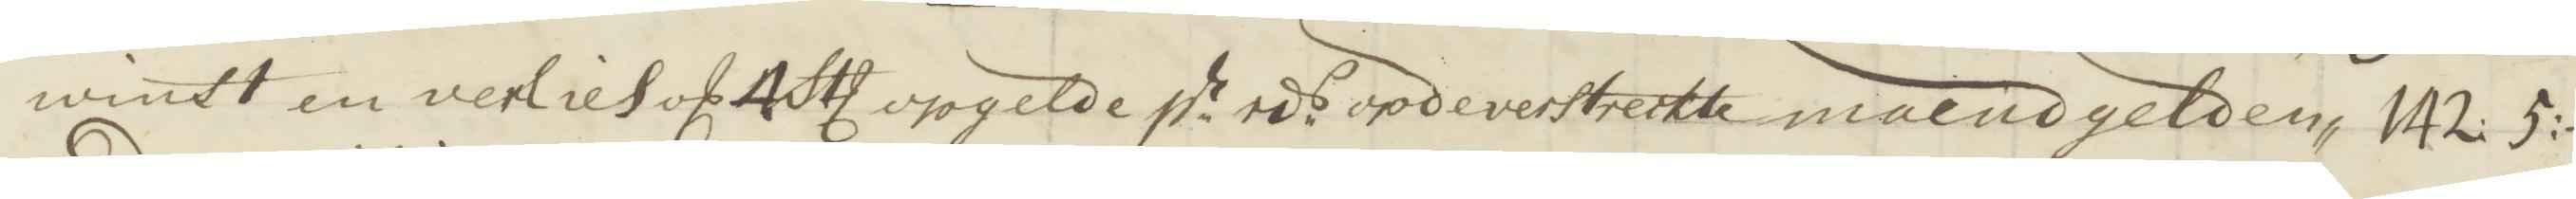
winst en verlies over 4 stx opgelde p„r rd„s op de verstreckte maendgelden„ 142:5:—
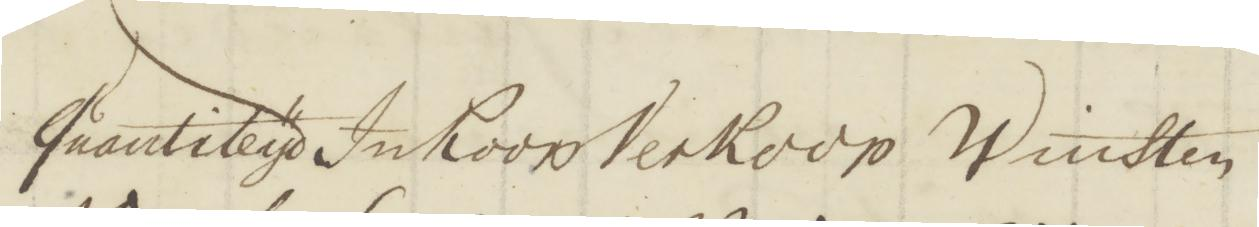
Quantiteijd Inkoop Verkoop Winsten
